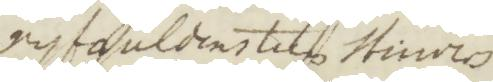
vyf guldens tien stuivers
